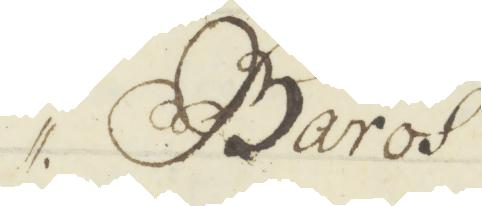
„ Baros
